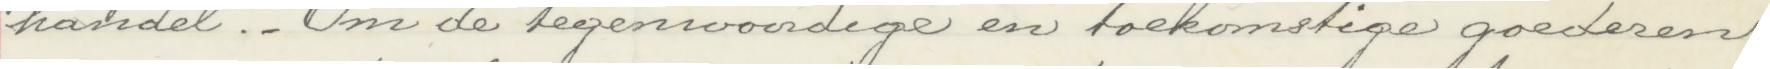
handel. - Om de tegenwoordige en toekomstige goederen,
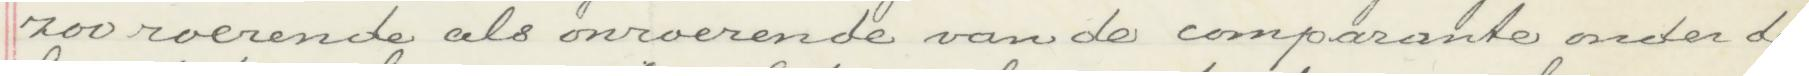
zoo roerende als onroerende van de comparante onder de
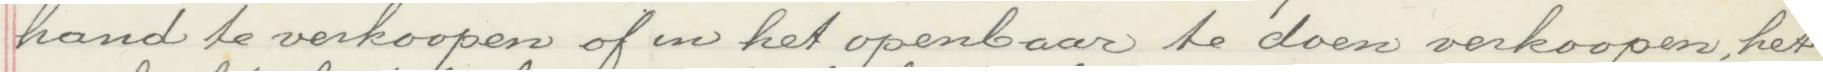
hand te verkoopen of in het openbaar te doen verkoopen, het
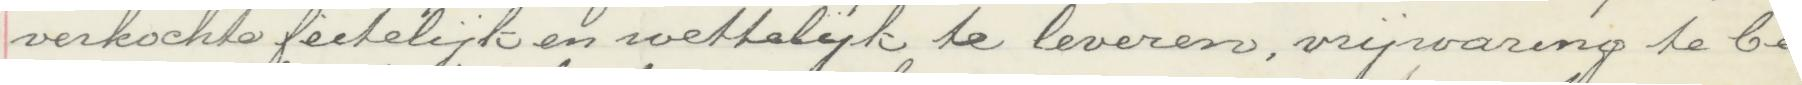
verkochte feitelijk en wettelijk te leveren, vrijwaring te be
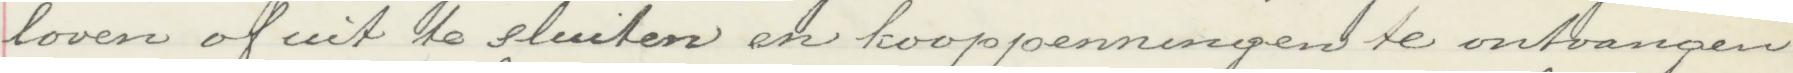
loven of uit te sluiten en kooppenningen te ontvangen
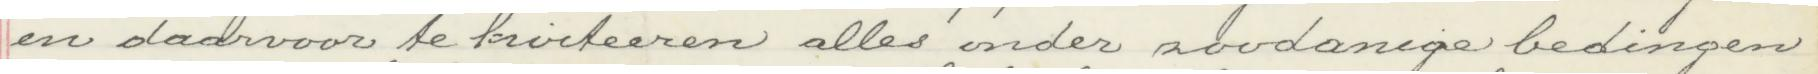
en daarvoor te kwiteeren alles onder zoodanige bedingen
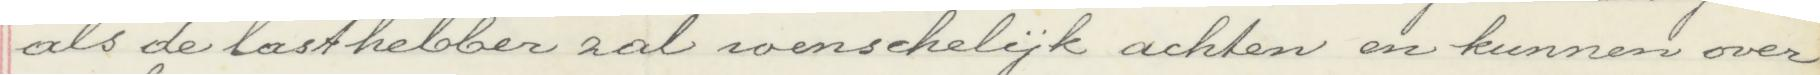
als de lasthebber zal wenschelijk achten en kunnen over
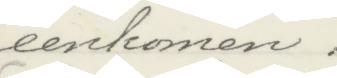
eenkomen.
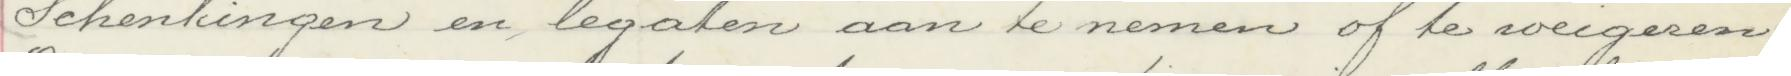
Schenkingen en legaten aan te nemen of te weigeren
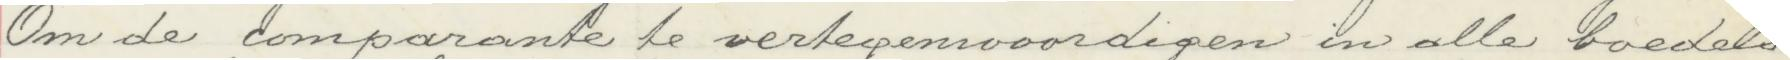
Om de Comparante te vertegenwoordigen in alle boedels
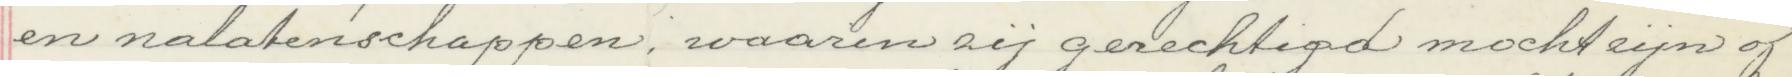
en nalatenschappen, waarin zij gerechtigd mocht zijn of
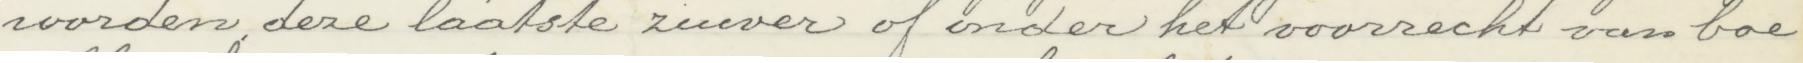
worden deze laatste zuiver of onder het voorrecht van boe
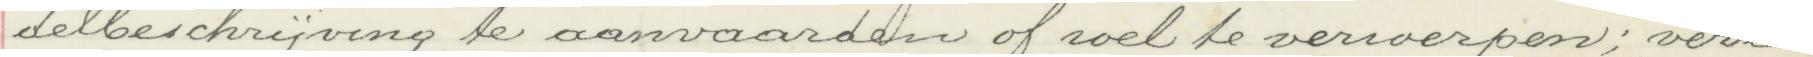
delbeschrijving te aanvaarden of wel te verwerpen; verze
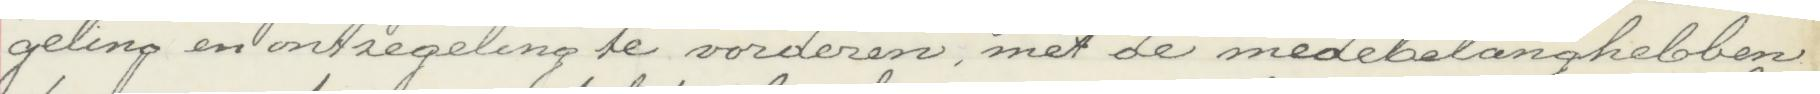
geling en ontzegeling te vorderen, met de medebelanghebben
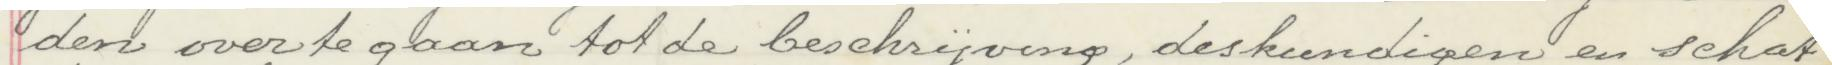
den over te gaan tot de beschrijving, deskundigen en schat
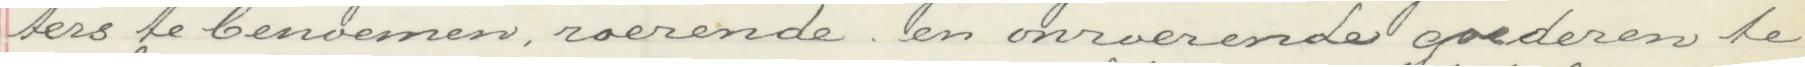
ters te benoemen, roerende . en onroerende goederen te
